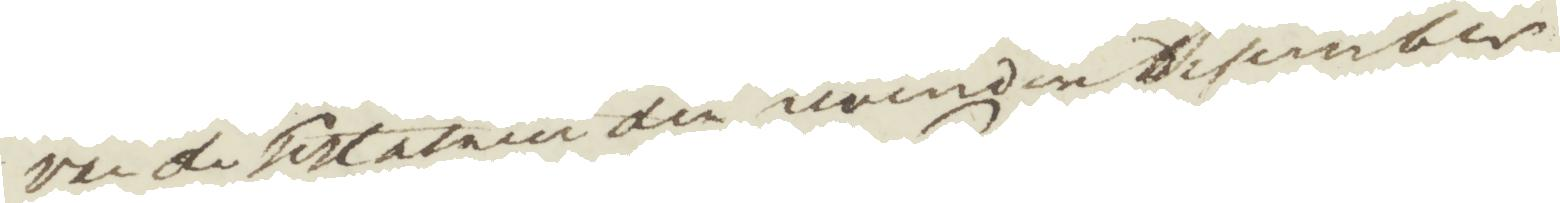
van de Testatrice den zevenden december
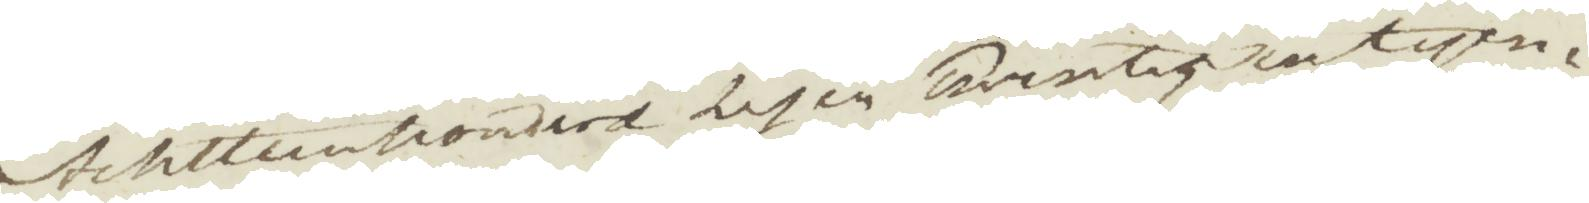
Achttienhonderd zes en Twintig integen,
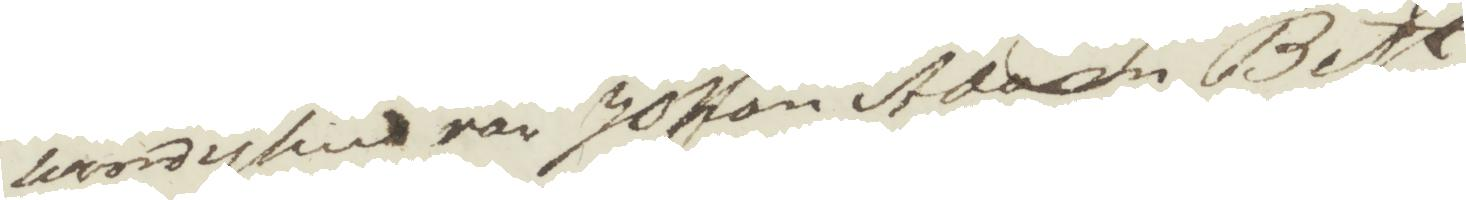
woordigheid van Johan Adam Best,
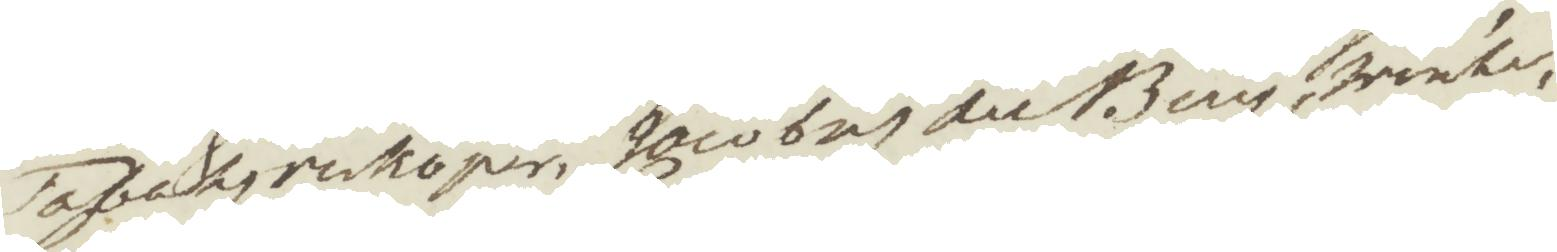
Tabaksverkoper, Jacobus du Buy, winke„
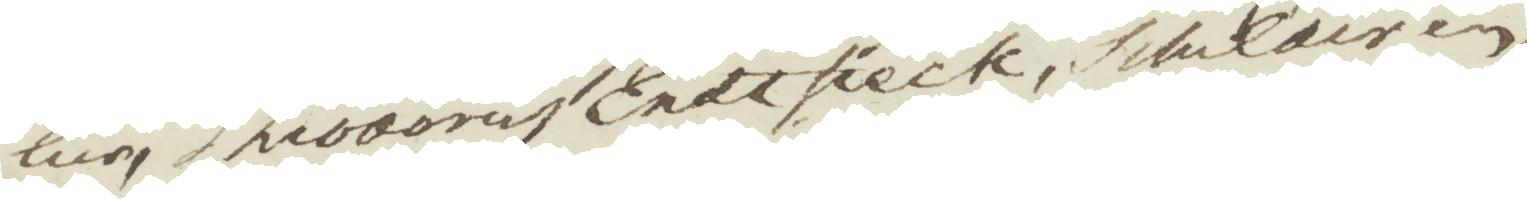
lier, Theodorus Erdtsieck, schilder en
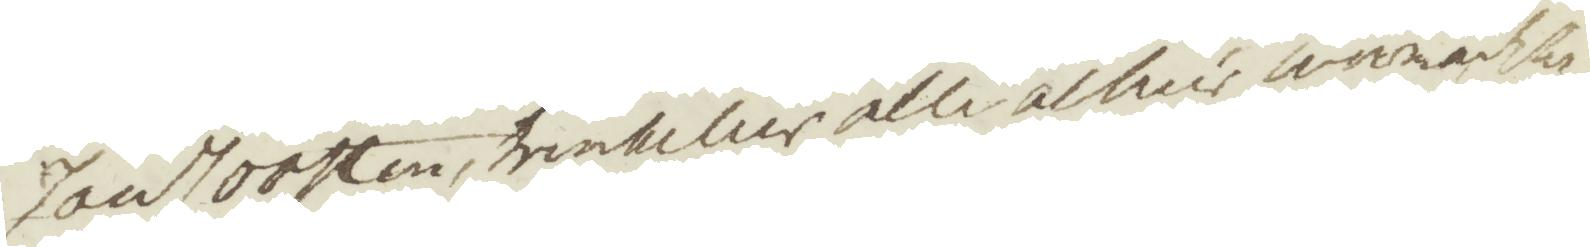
Jan Joosten, winkelier alle alhier woonachtig
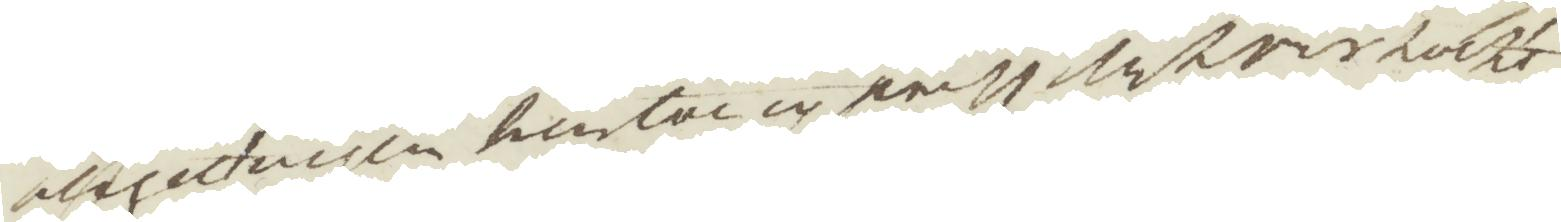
als getuigen hiertoe expresselyk verzocht,
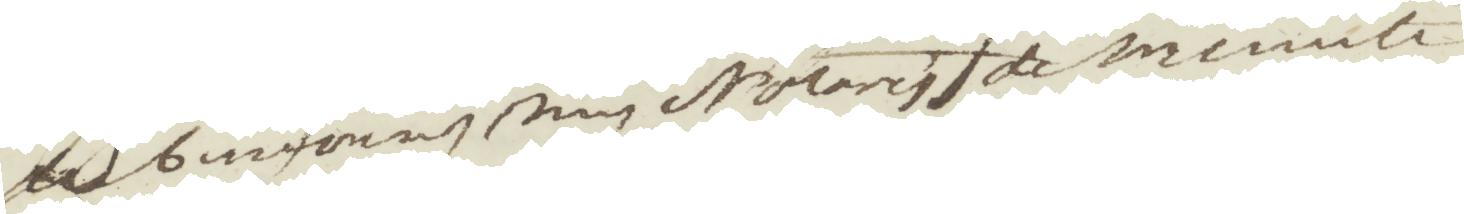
die benevens my Notaris de minute
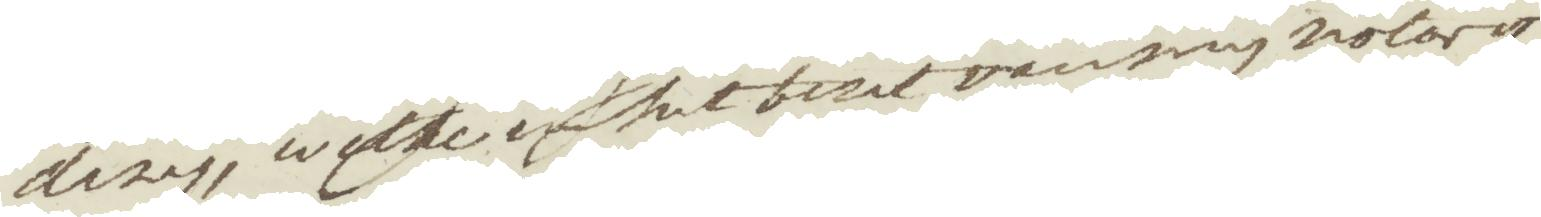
dezes, welke in het bezit van my notaris
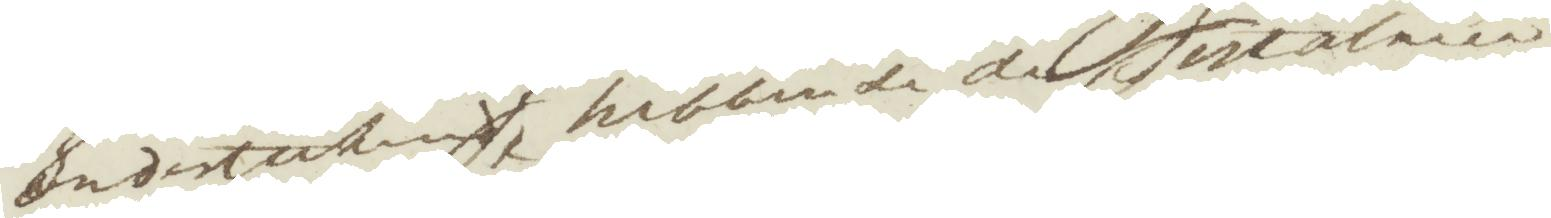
ondertekend, hebbende de Testatrice
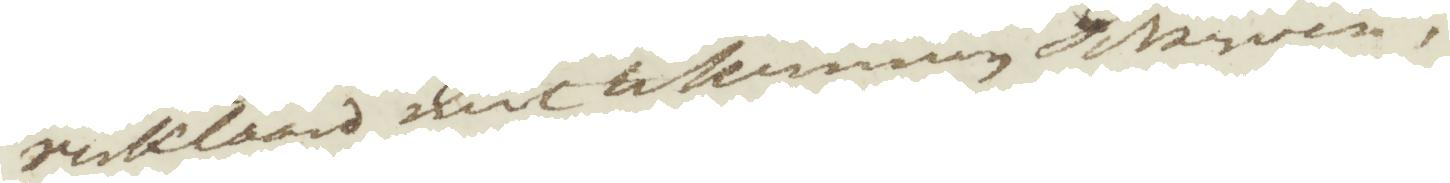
verklaard niet te kunnen schrijven,
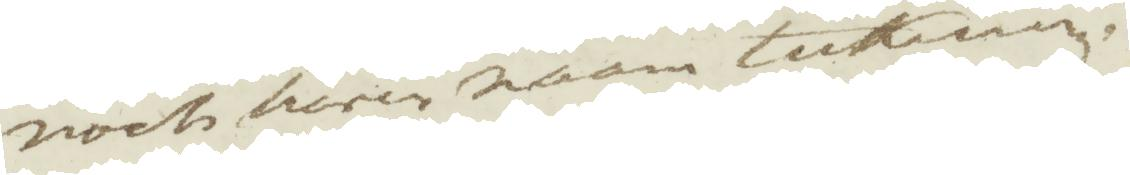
noch haren naam teekenen,
